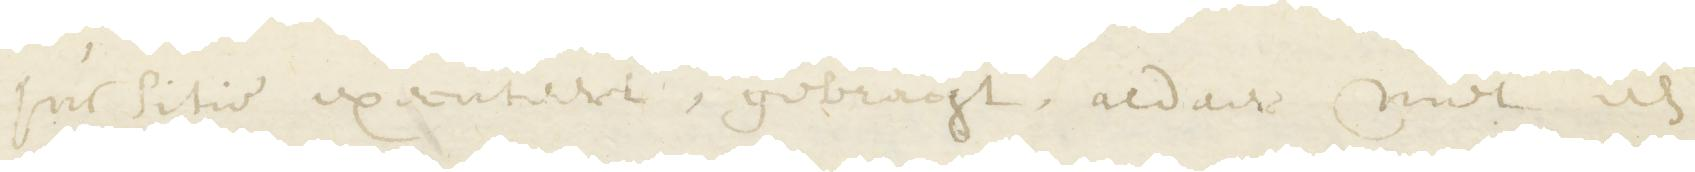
justitie executeert, gebragt, aldaer met een
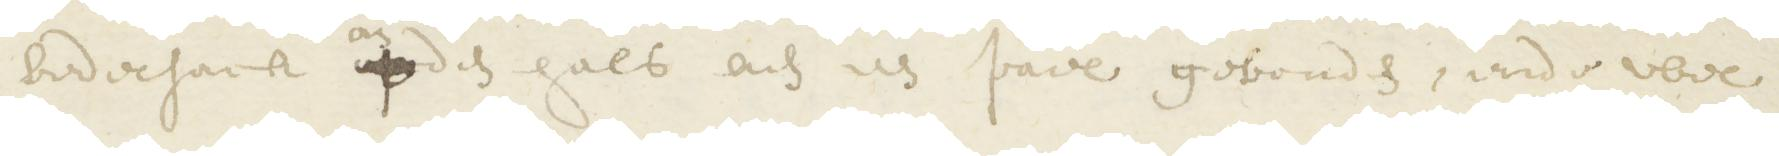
bedelsack enden hals aen een pael gebonden, ende wel
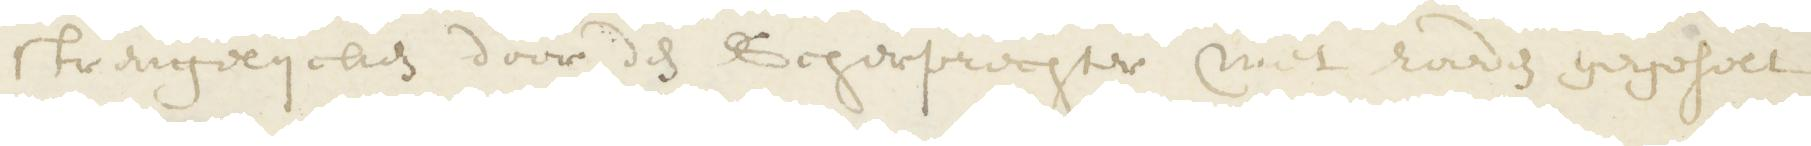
strengelijcken door dien Scherprechter niet haden gegeselt
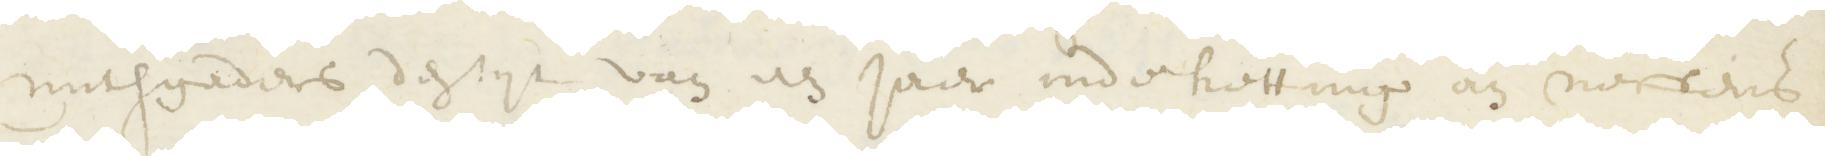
mitsgaders de tijt van een jaer inde ketting en neffens
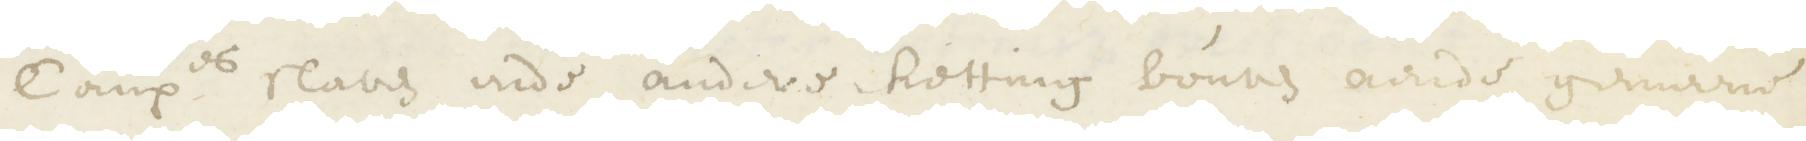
Comp:es slaven ende andere ketting bouren aende gemeene
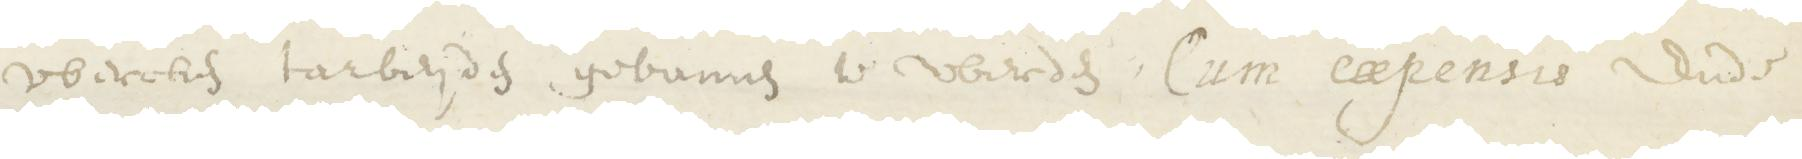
wercken tarbijden gebannen te werden Cum caepensis Ende
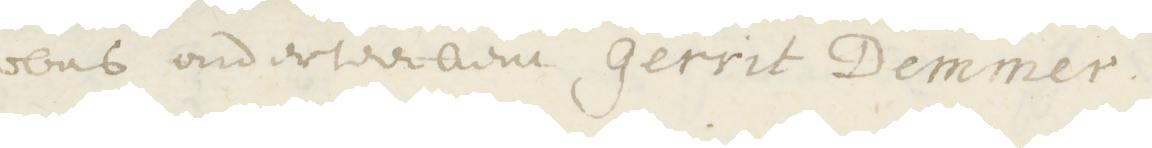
was onderteeckent Gerrit Demmer.
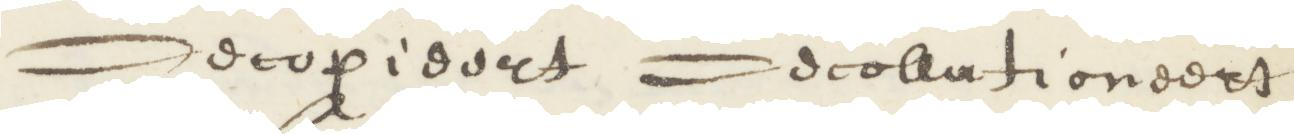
Gecopieert Gecollationeert
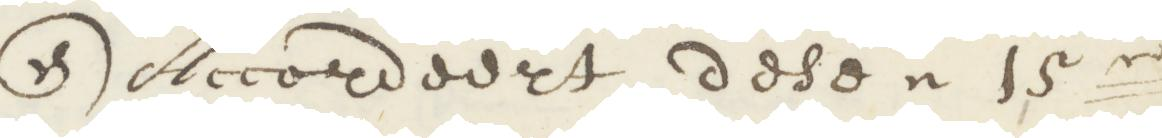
ende Accordeert desen 15=en
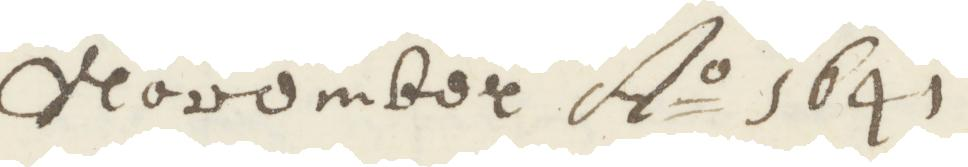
Novemder A=o 1641
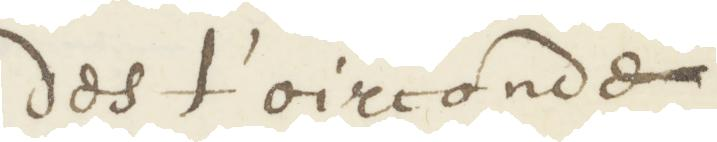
des t' oirconde
